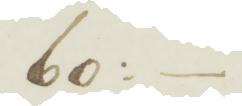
60: —
